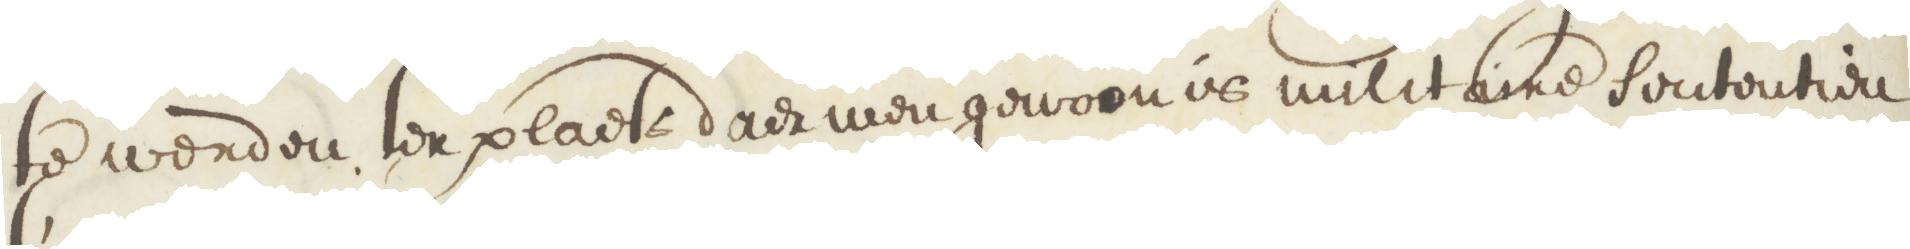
te werden ter plaets daer men gewoon is militaire Sententien
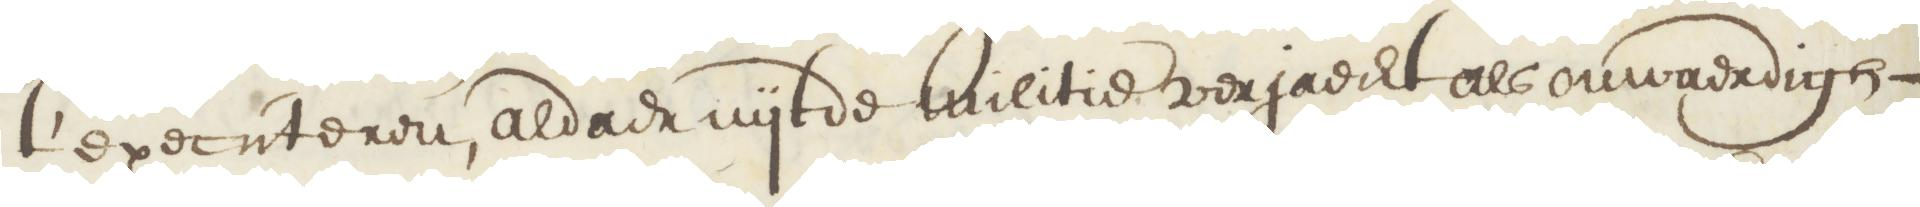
t' executeren, aldaer uijtde militie verjaecht als onwaerdigh
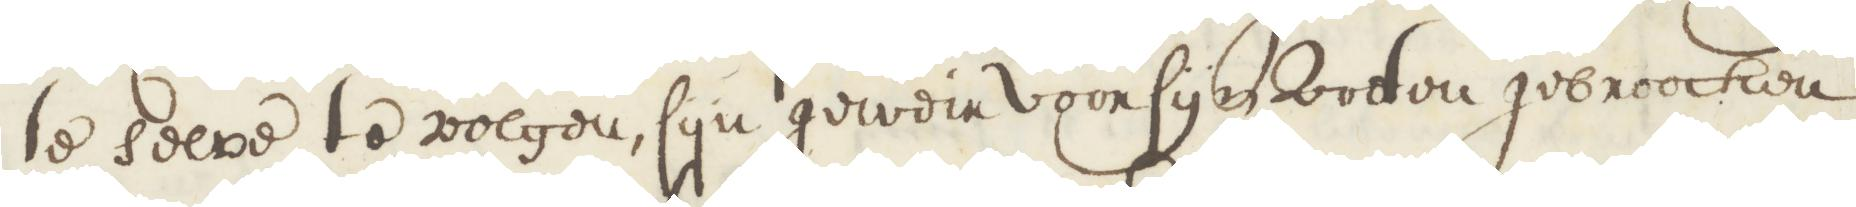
te selve te volgen, sijn geweir voor sijn voeten gebroocken
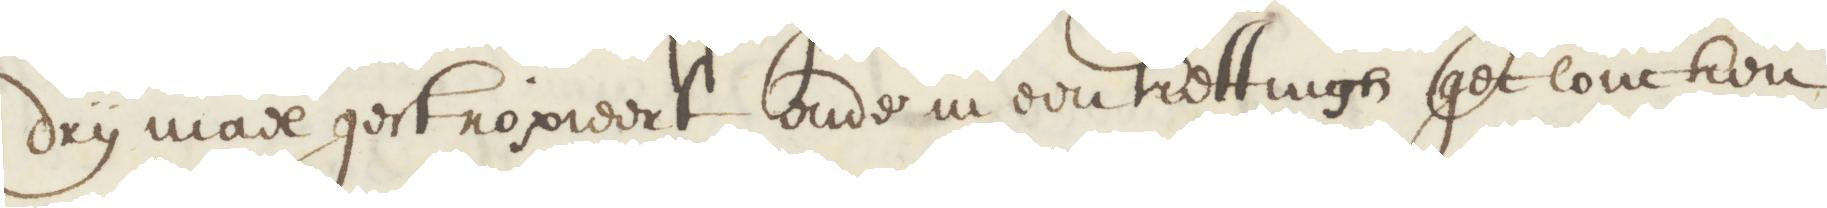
drij mael gestropieert, ende in een kettingh gecloncken
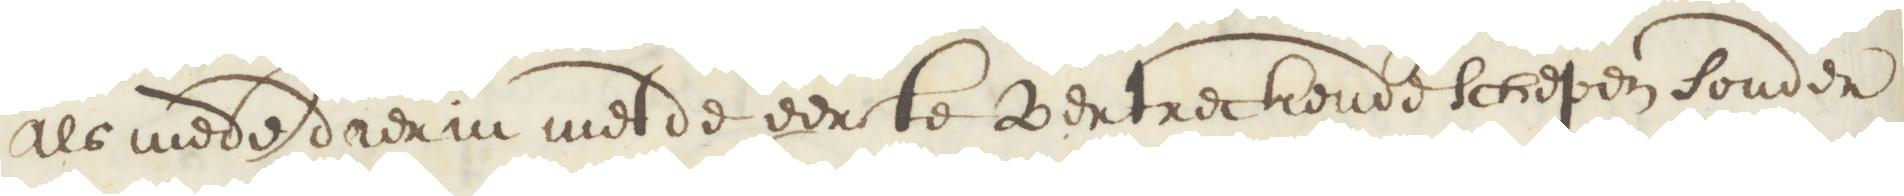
als mede daer in met de eerste vertreckende schepen sonder
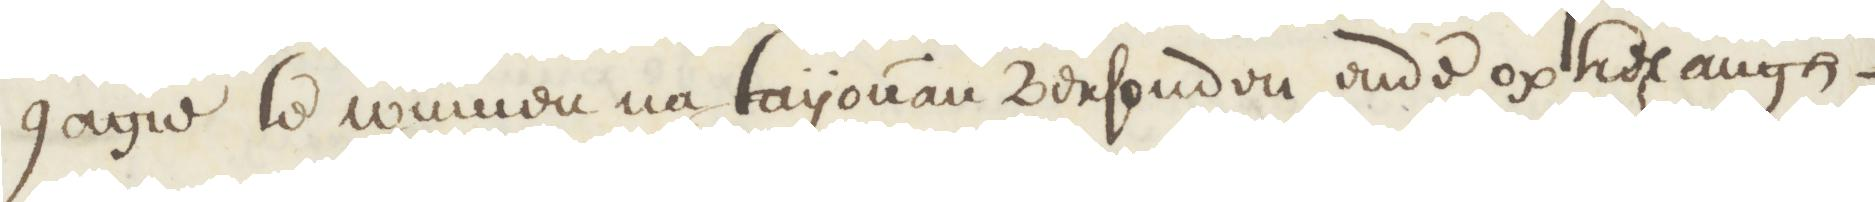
gagie te winnen na taijouan versonden ende op kelangh
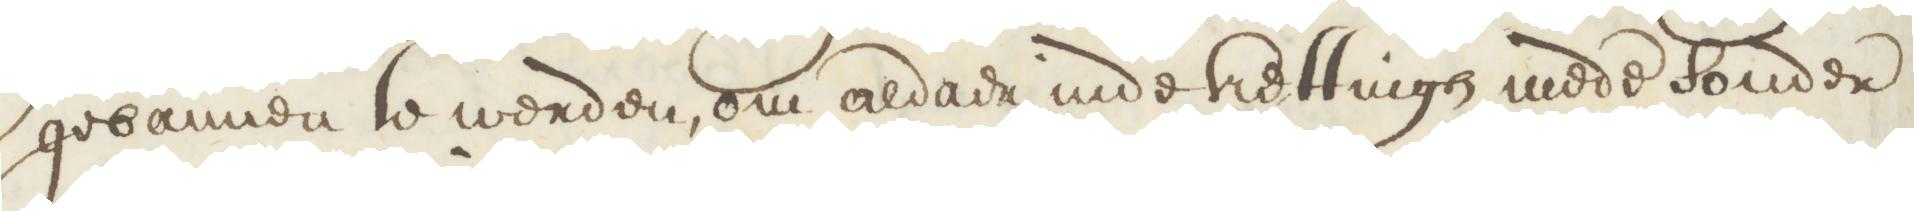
gebannen te werden, om aldaer inde kettingh mede Sonder
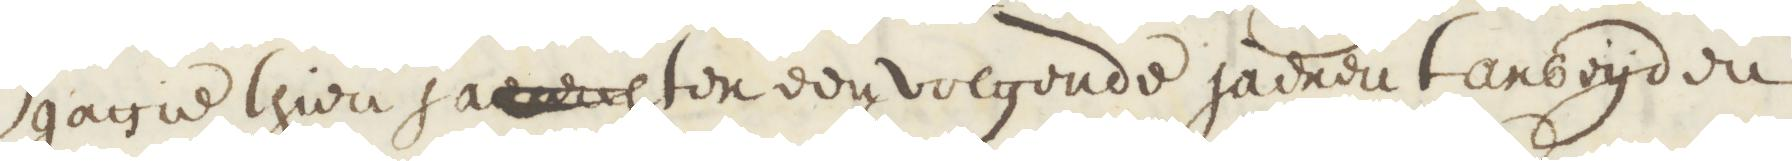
gagie thien j achter een volgende jaeren t arbeijden
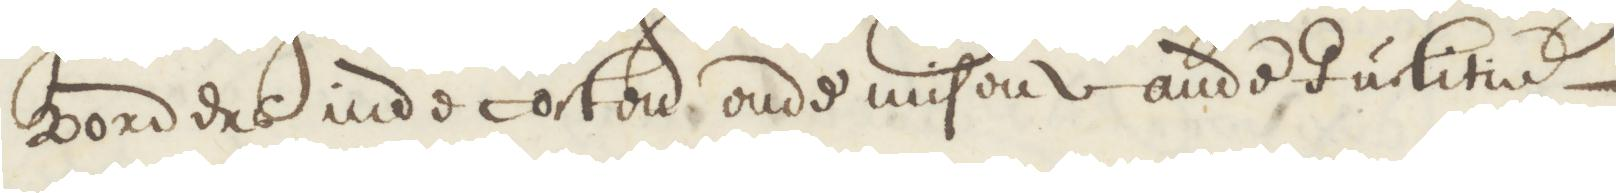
vorders inde costen ende misen vande Iustitie
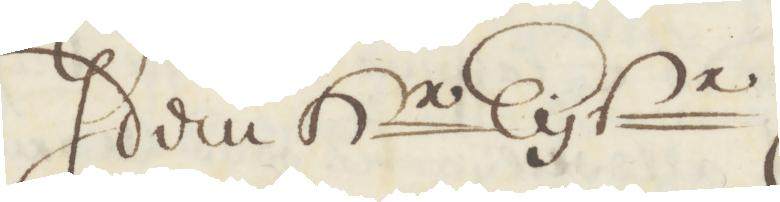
Idem H=r Eijs's=r
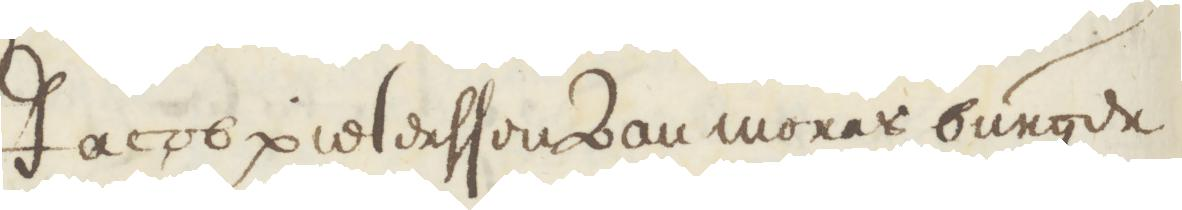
Jacob pieterssen van moras burger
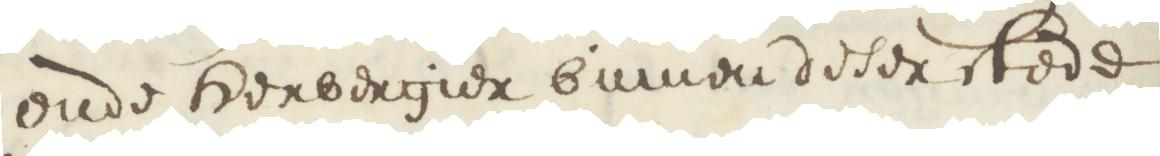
ende herbergier binnen deser stede
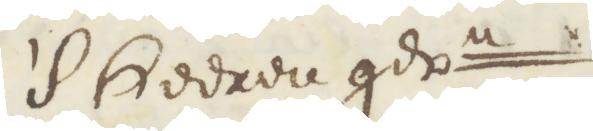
'S Heeren gev=n
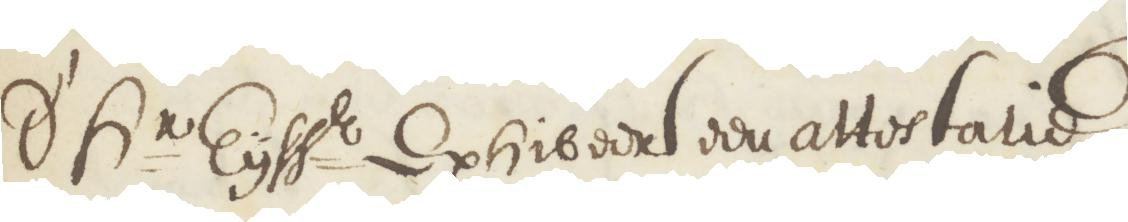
D' H=r Eijss=r Exhibeert een attestatie
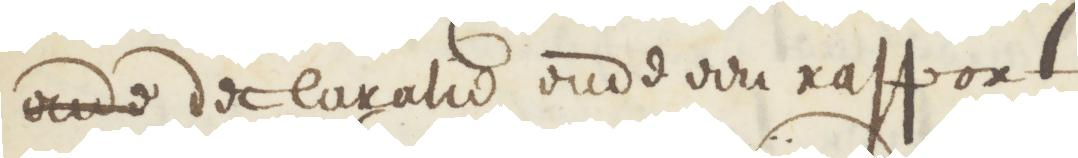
ande declaratie ende een rapport
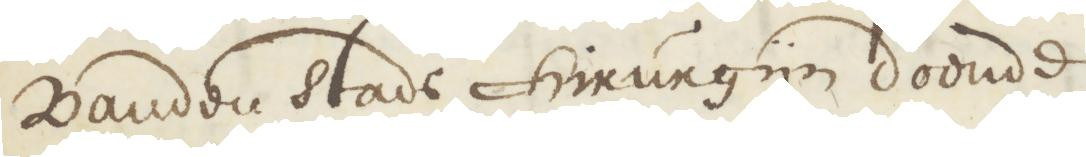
vanden stads chirurgijn doende
